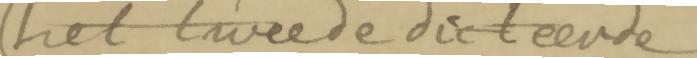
het tweede dicteerde
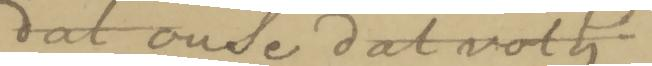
dat onse dat roth
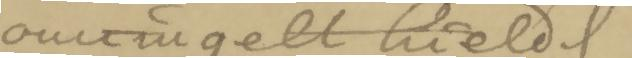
omcingelt hielden
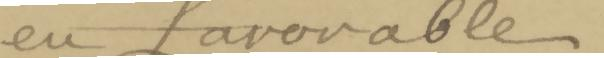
en favorable
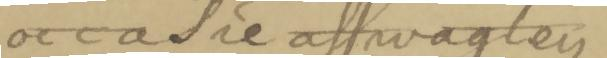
occasie affwagten
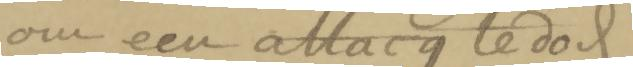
om een attacq te doen
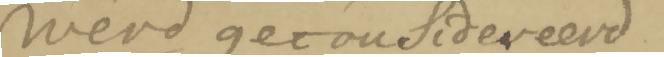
werd geconsidereerd
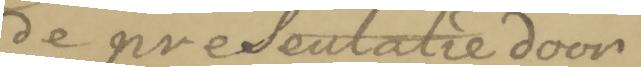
de presentatie door
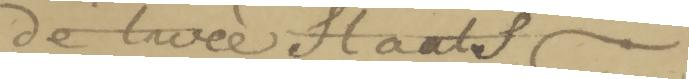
de twee staats —
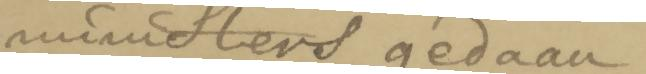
ministers gedaan
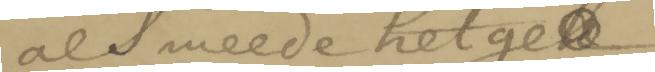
als meede het geh
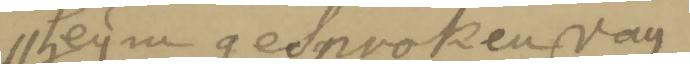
„heijm gesproken van
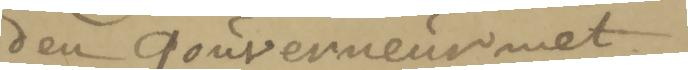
den gouverneur met
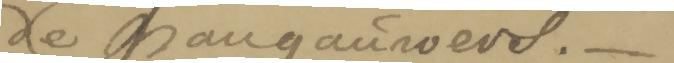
de pangauwers. —
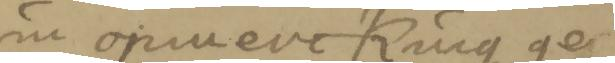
in opmercking ge
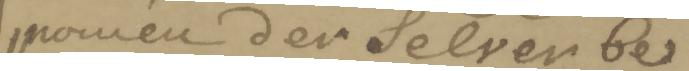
„nomen der selven be
